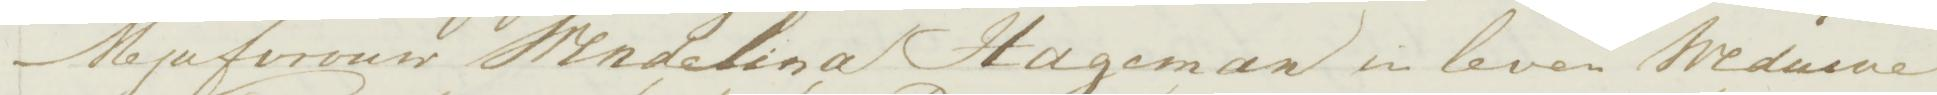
Mejufvrouw Wendelina Hageman in leven Weduwe
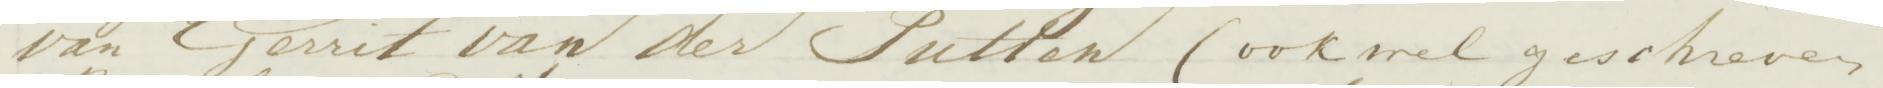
van Gerrit van der Putten (ook wel geschreven
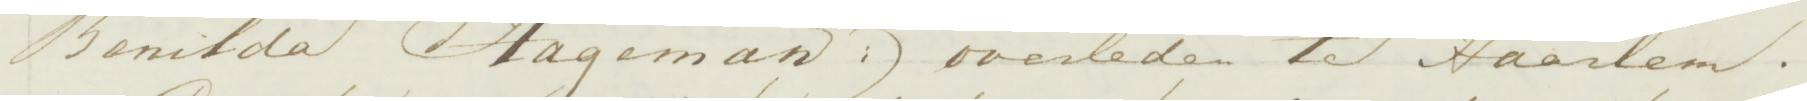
Benilda Hageman:) overleden te Haarlem.
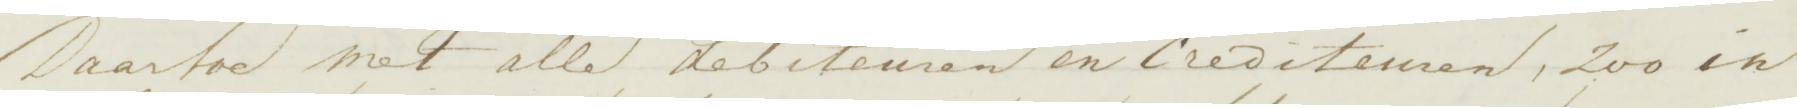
Daartoe met alle debiteuren en crediteuren, zoo in
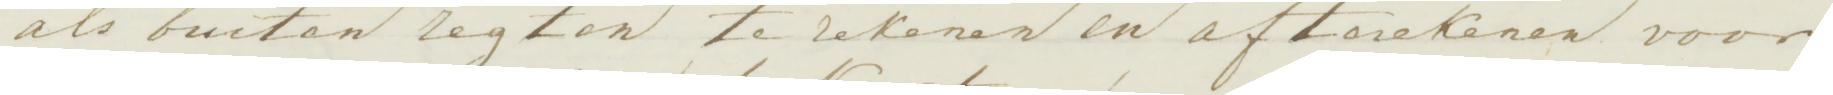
als buiten regten te rekenen en af terekenen voor
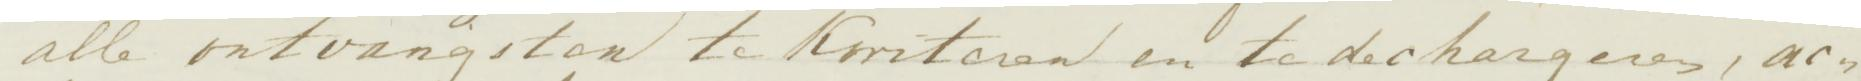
alle ontvangsten te kwiteren en te dechargeren, ac„
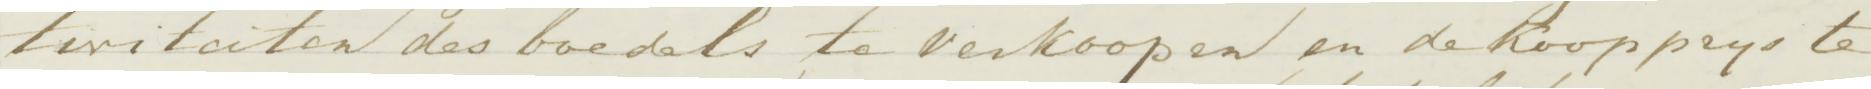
tiviteiten des boedels te verkoopen en de koopprys te
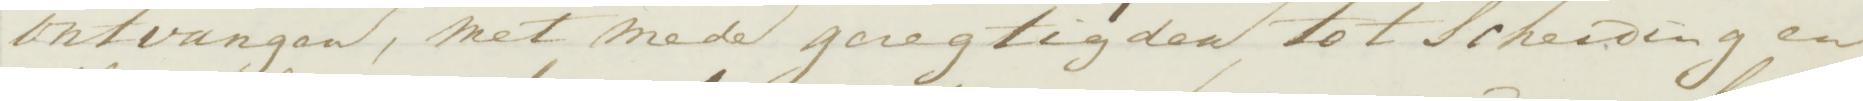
ontvangen, met mede geregtigden tot scheiding en
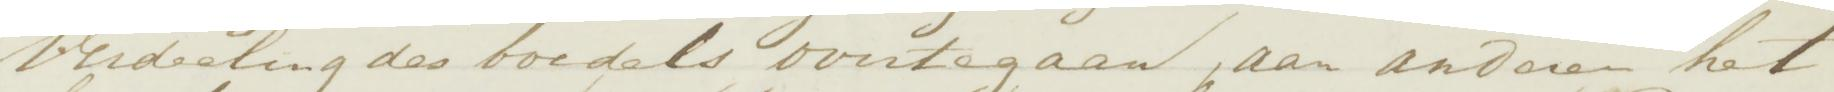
Verdeeling des boedels overtegaan, aan anderen het
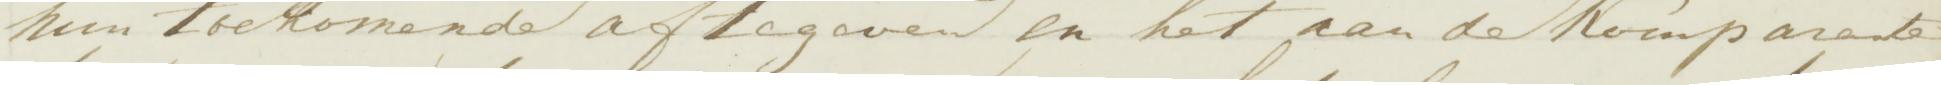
hun toekomende af te geven en het aan de Komparente
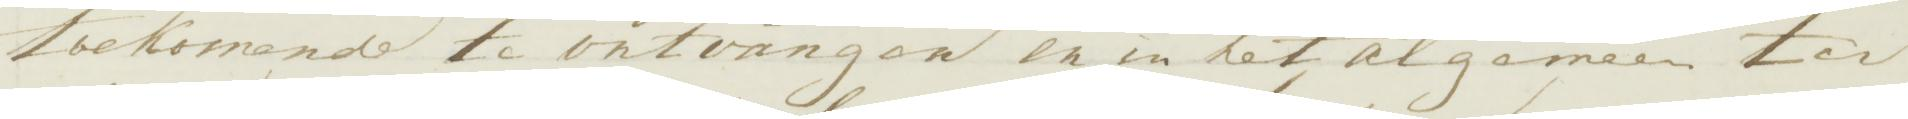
toekomende te ontvangen en in het algemeen ter
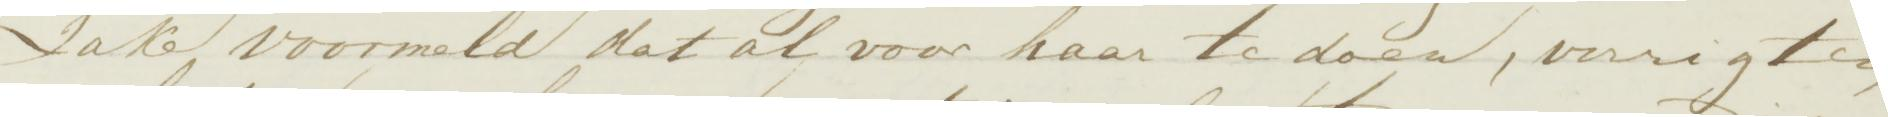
zake voormeld dat al voor haar te doen, verrigten
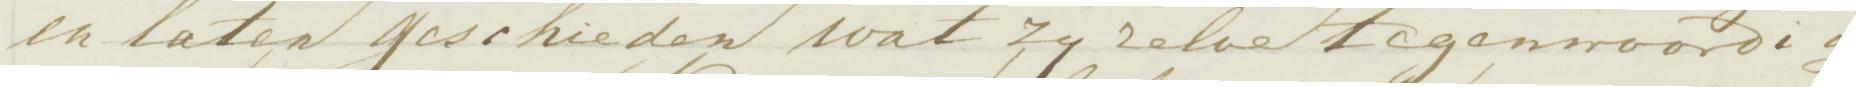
en laten geschieden wat zy zelve tegenwoordig
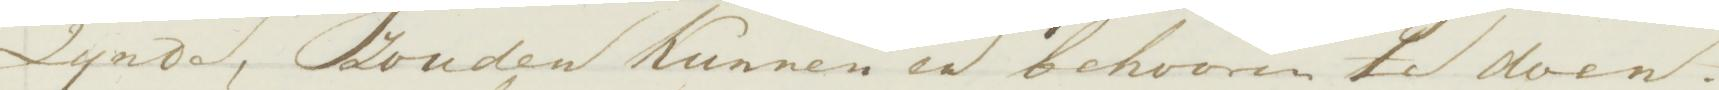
zijnde, zouden kunnen en behooren te doen.
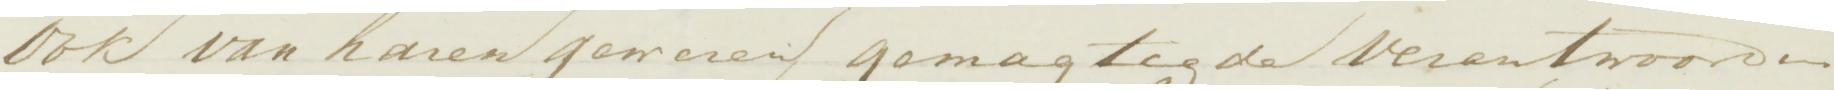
Ook van haren gewezen gemagtigde verantwoordin
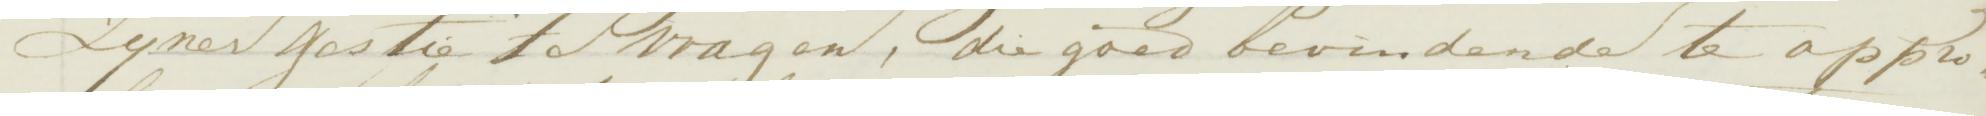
zyner gestie te vragen, die goed bevindende te appro
